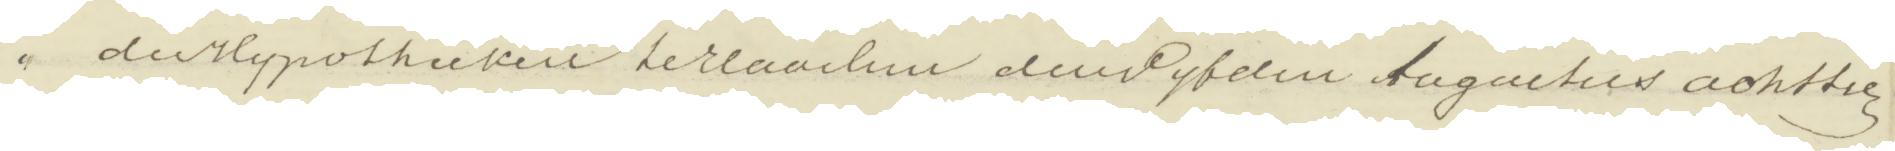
„ der Hypotheeken te Haarlem den Vyfden Augustus achttien
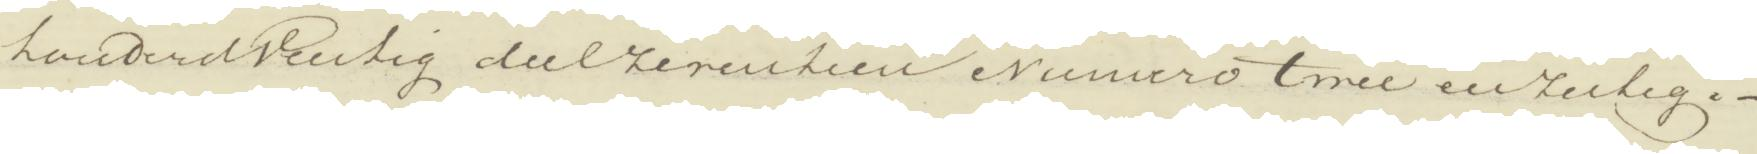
honderd Veertig deel zeventien Numero twee en zestig
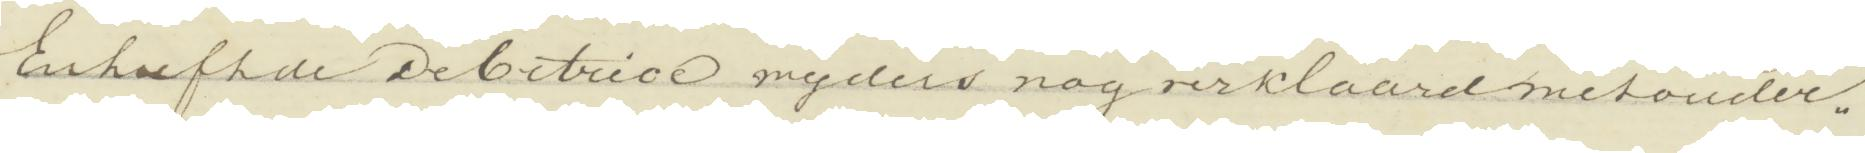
En heeft de Debetrice wyders nog verklaard met onder„
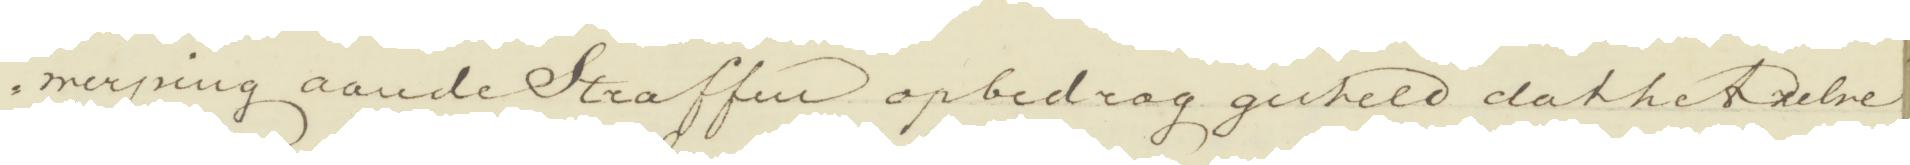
„werping aan de Straffen op bedrog gesteld dat het zelve
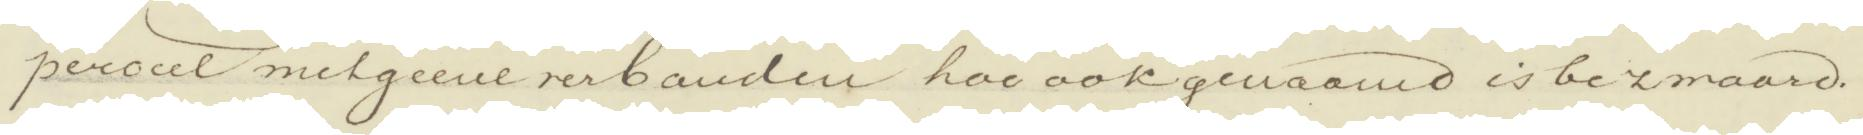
perceel met geene verbanden hoe ook genaamd is bezwaard.
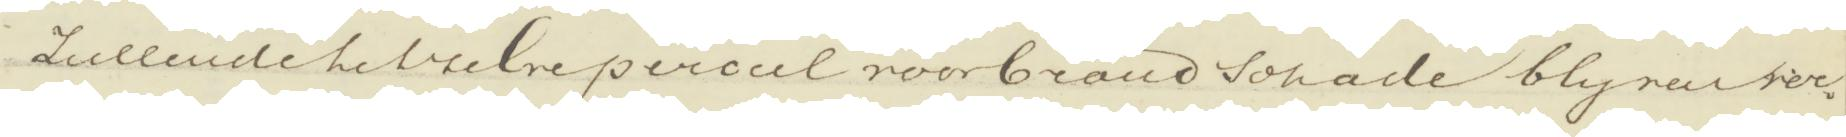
zullende hetzelve perceel voor brand schade blyven ver„
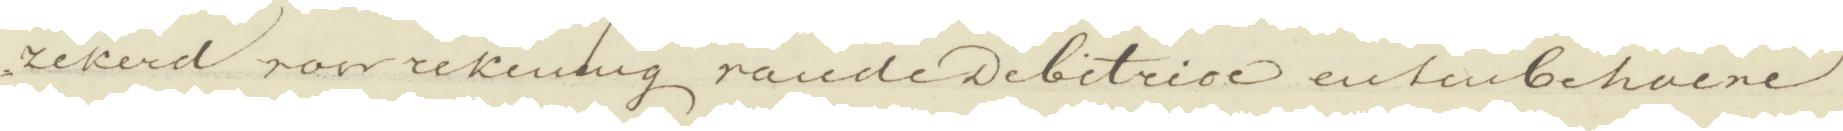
zekerd voor rekening van de Debitrice en ten behoeve
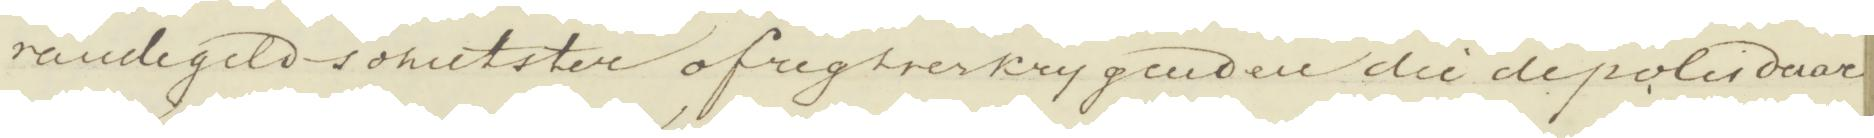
vande geldschietster of regtverkrygenden die de polis daar
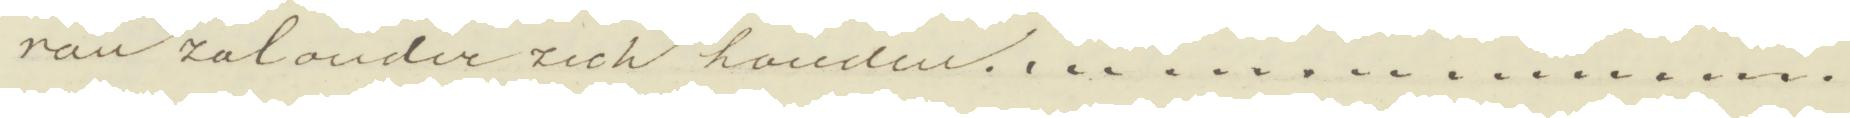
van zal onder zich houden. . . . . . . . . . . . . . . . . . . .
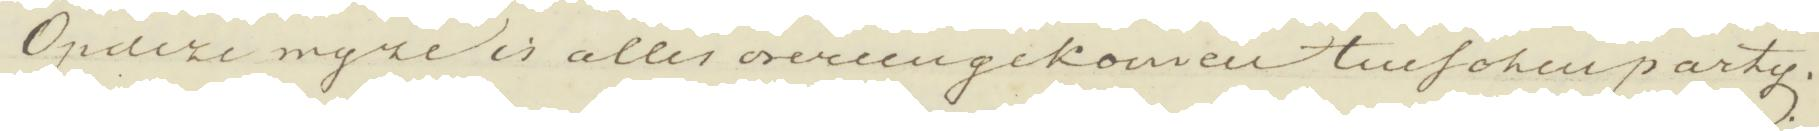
Op deze wyze is alles overeengekomen tusschen party
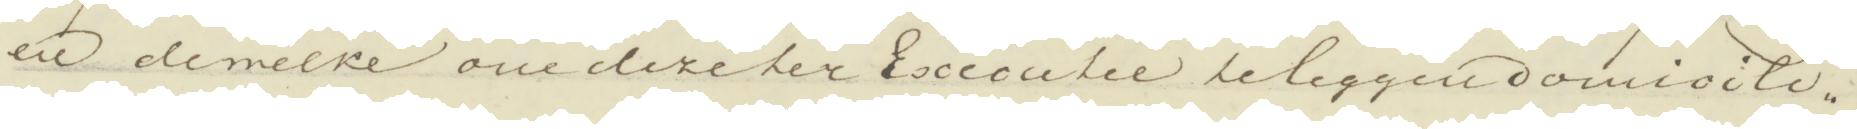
en dewelke om deze ter Executie te leggen domicili„
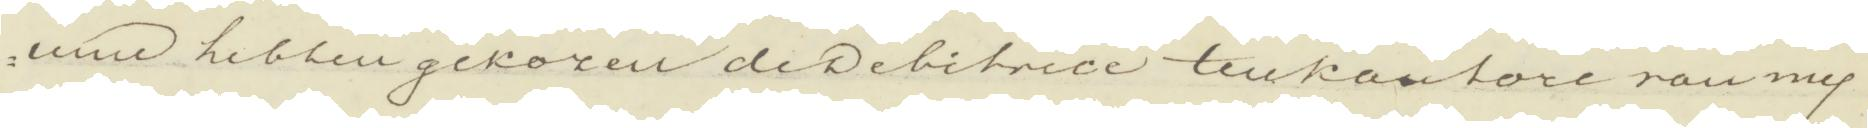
=um hebben gekozen de Debitrice ten kantore van my
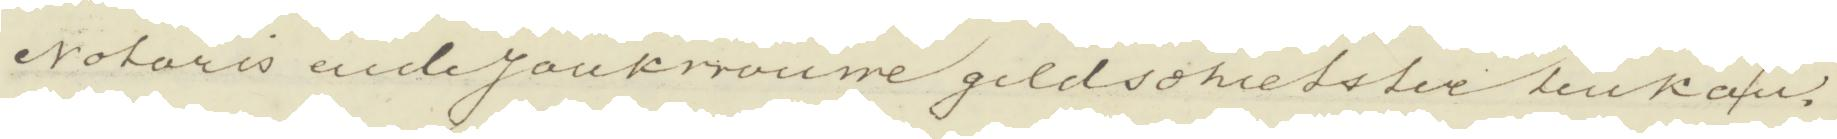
Notaris ende Jonkvrouwe geldschietster ten kan„
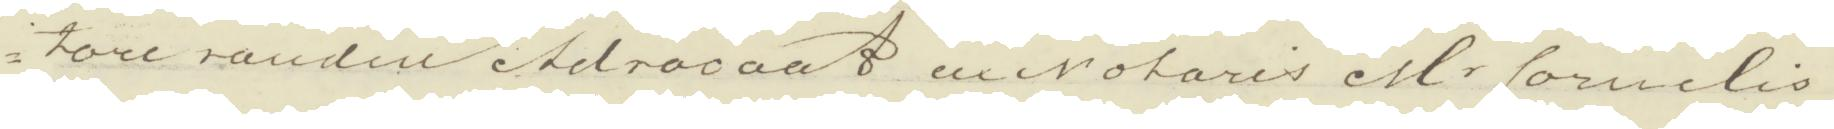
=tore vanden Advocaat en Notaris Mr Cornelis
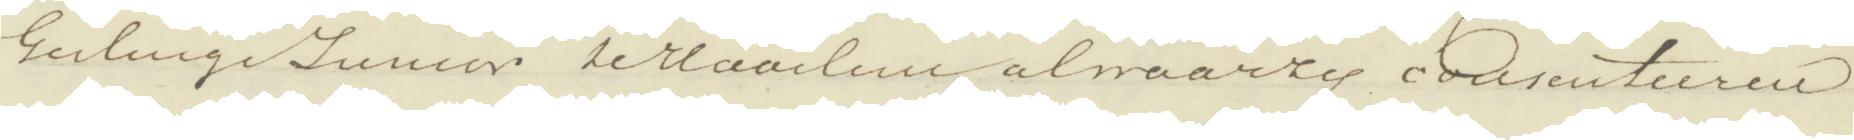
Gerlings Iunior te Haarlem alwaarzy consenteeren
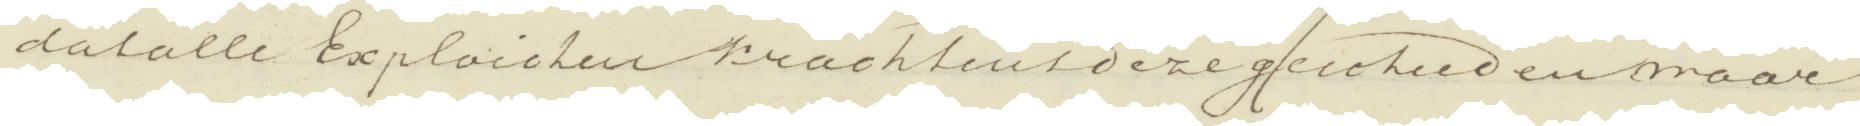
dat alle Exploicten krachtens deze geschied en waar
